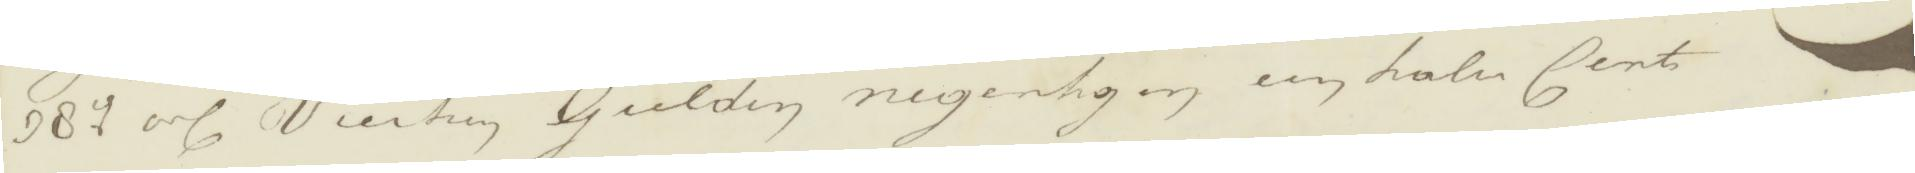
38½ oC Veertien Gulden negentig en een halve Cent
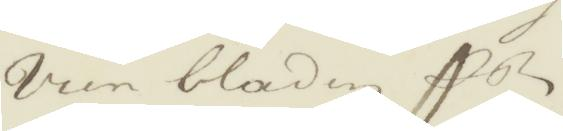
vier bladen
